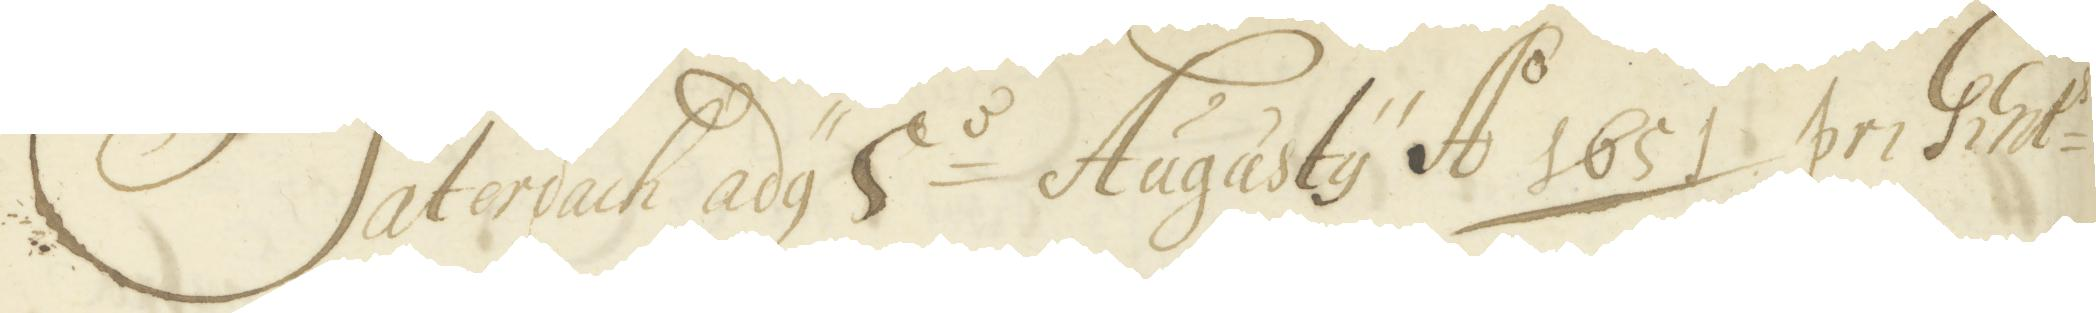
Saterdach adij 5=e Augustij Ao 1651 present=s
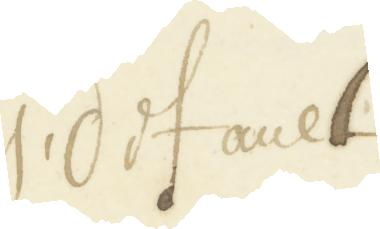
1.' default
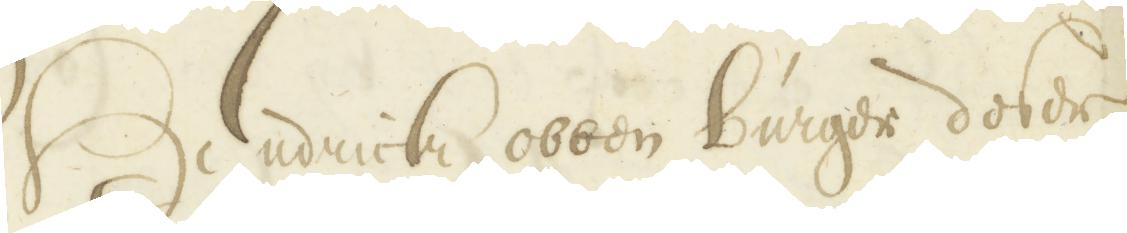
Hendrick obben burger deser
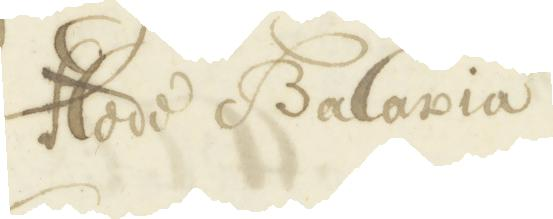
stede Batavia
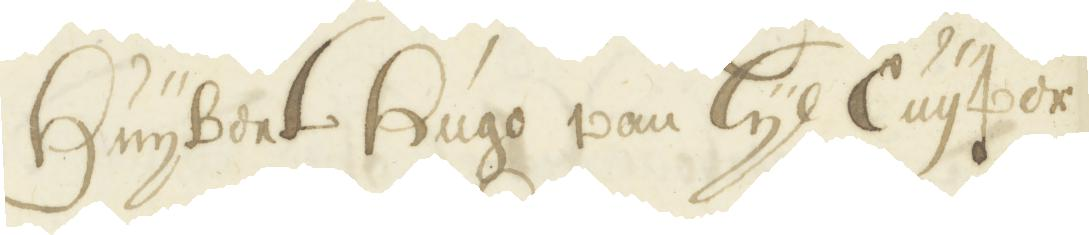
Huijbert Hugo van tijl Cuijper
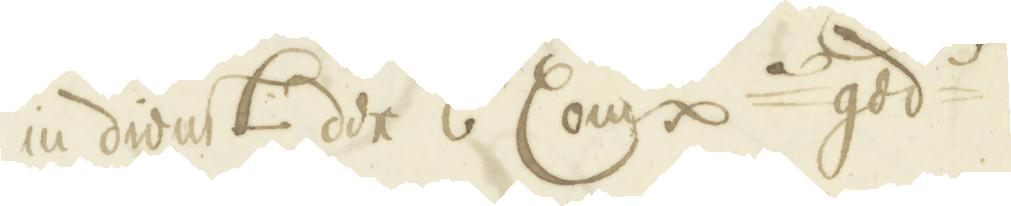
in dienst der E Comp=e ged=e
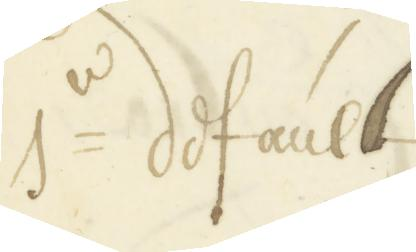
1=e default
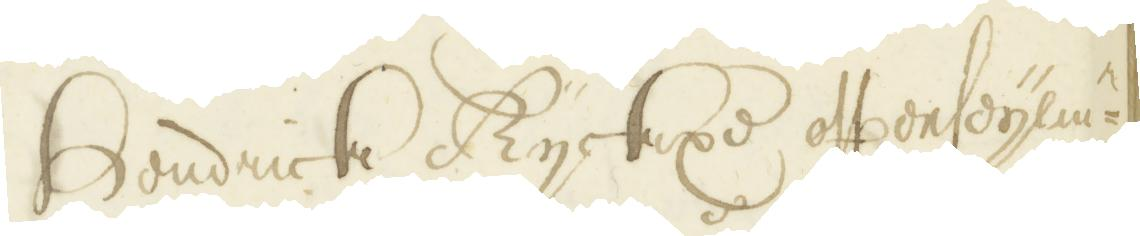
Hendrick Rijckxe opperseijlm=r
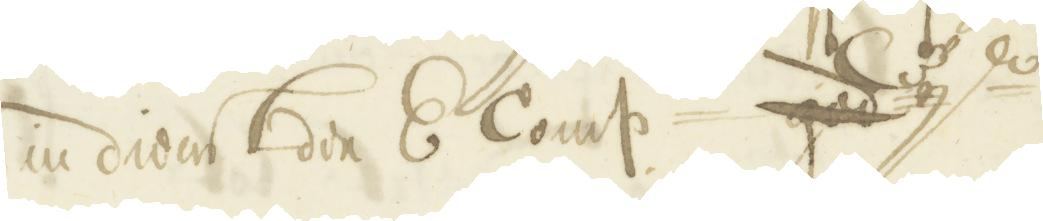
in dienst der E Comp=e ged=eEy=r
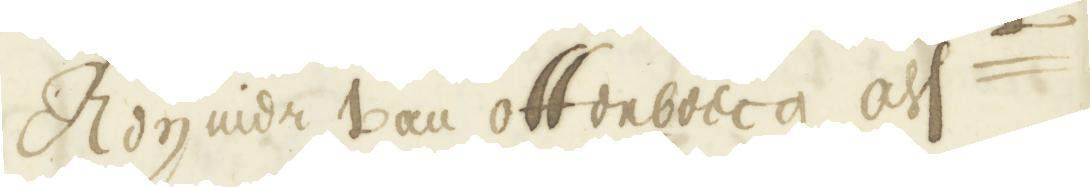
Reijnier van otterbeecq ass=t
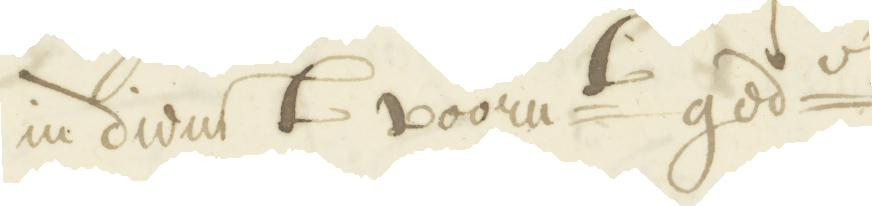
in dienst voorn=t ged=e
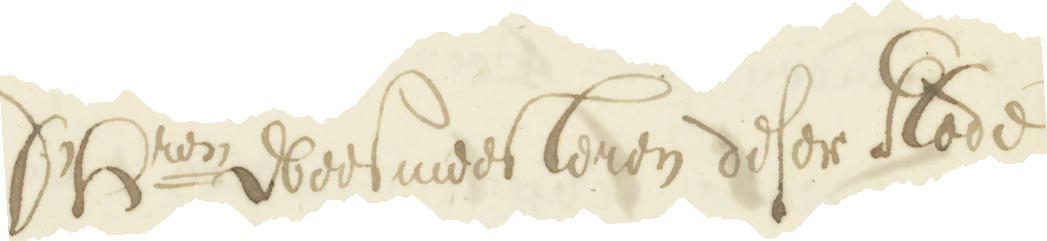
d’ H=ren weesmeesteren deser stede
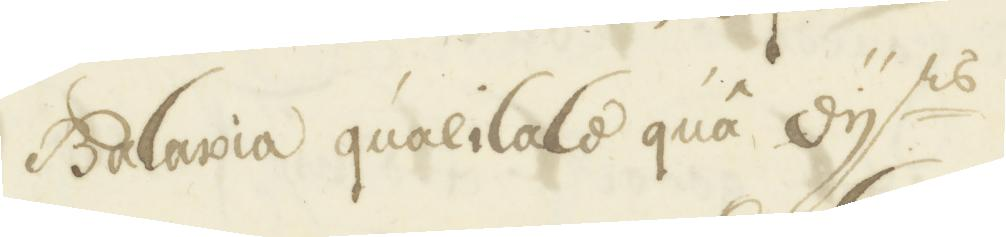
Batavia qualitate qua eij=rs
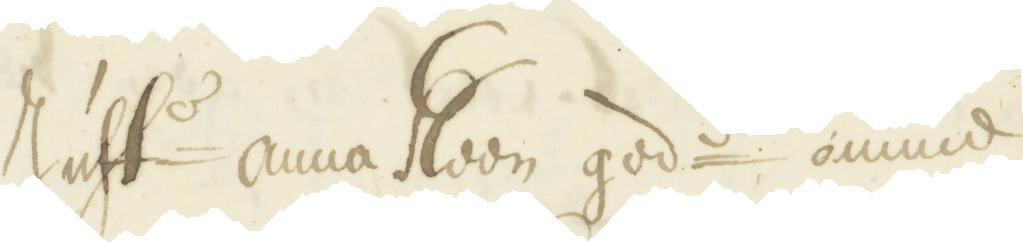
Juff=e anna steen ged=e omme
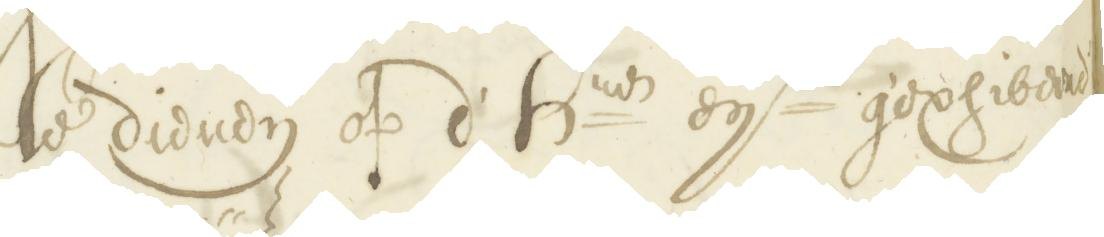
te dienen op d’ H=ren eij=rs gexhibeerd
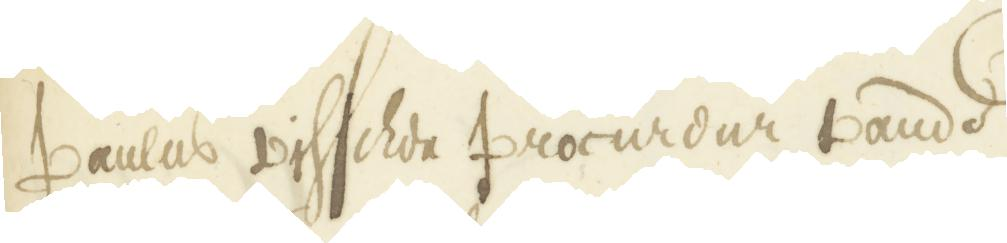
paulus visscher procureur vande
